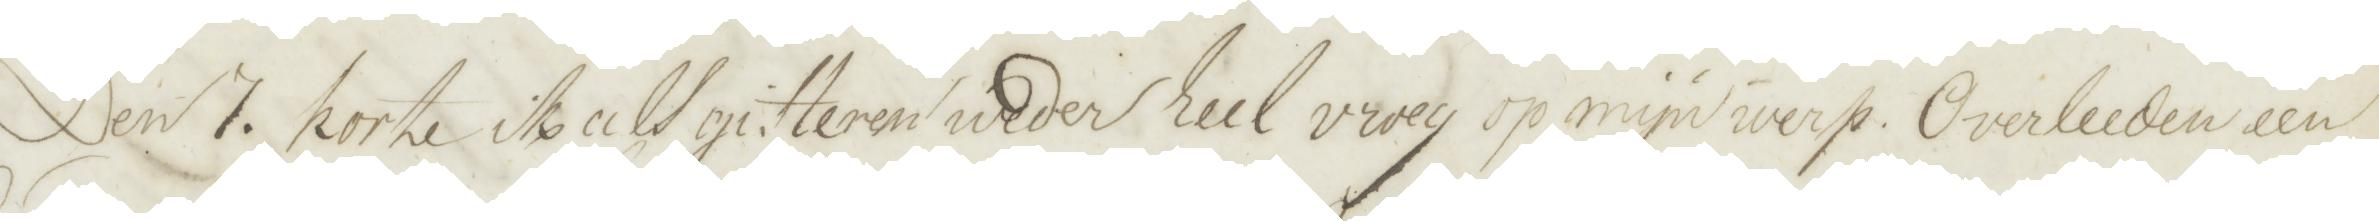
Den 7. korte ik als gisteren weder heel vroeg op mijn werp. Overleeden een
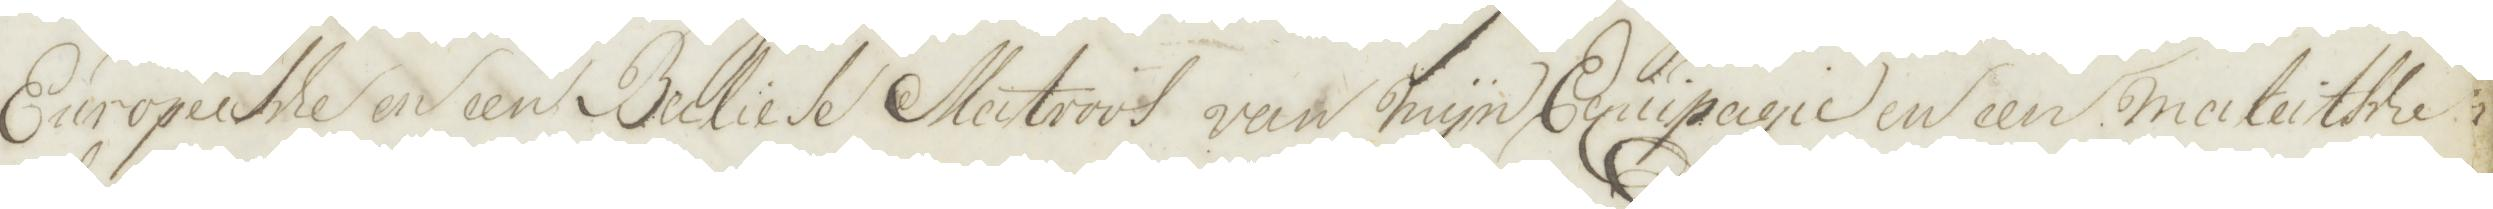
Europeesche en een Beeliese Matroos van mijn Equipagie en een maleitsche
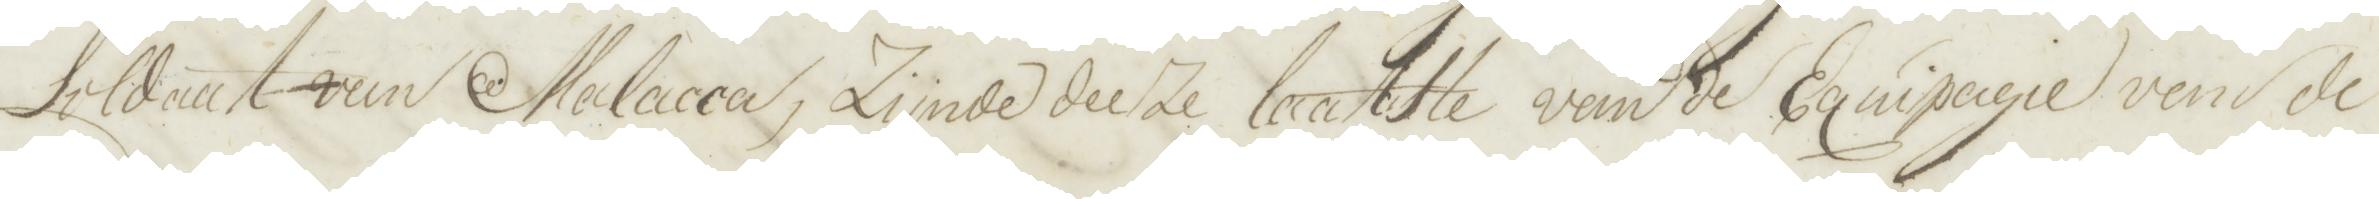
soldaat van Malacca, zijnde deeze laatste van de Equipagie van de
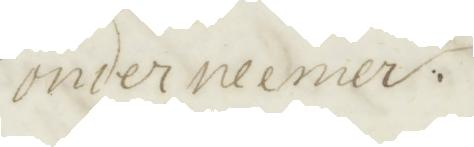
onderneemer.
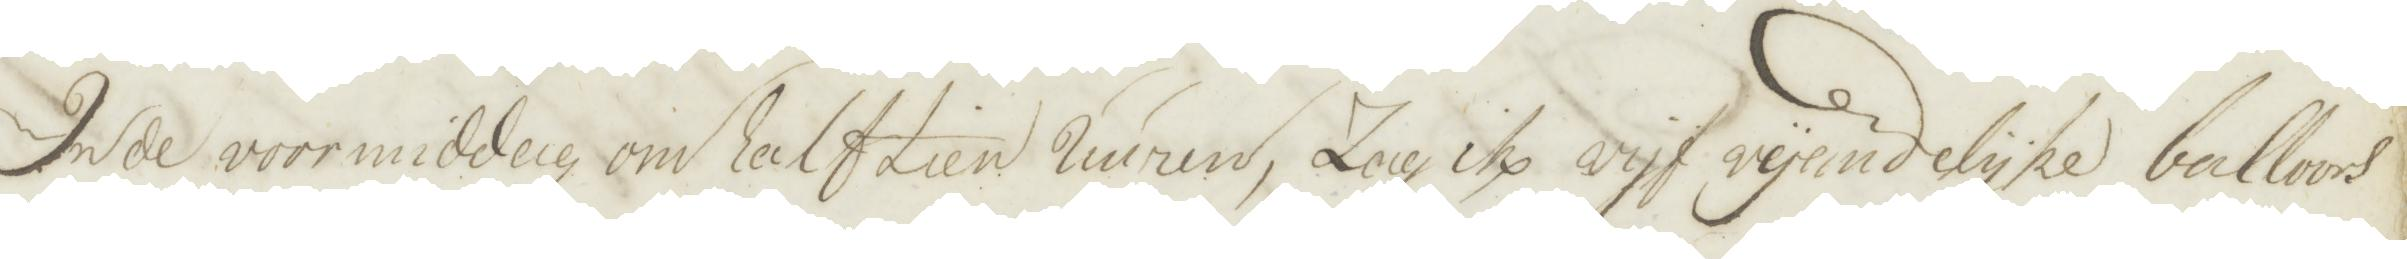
In de voormiddag om halftien uuren, zag ik vijf vijandelijke balloors
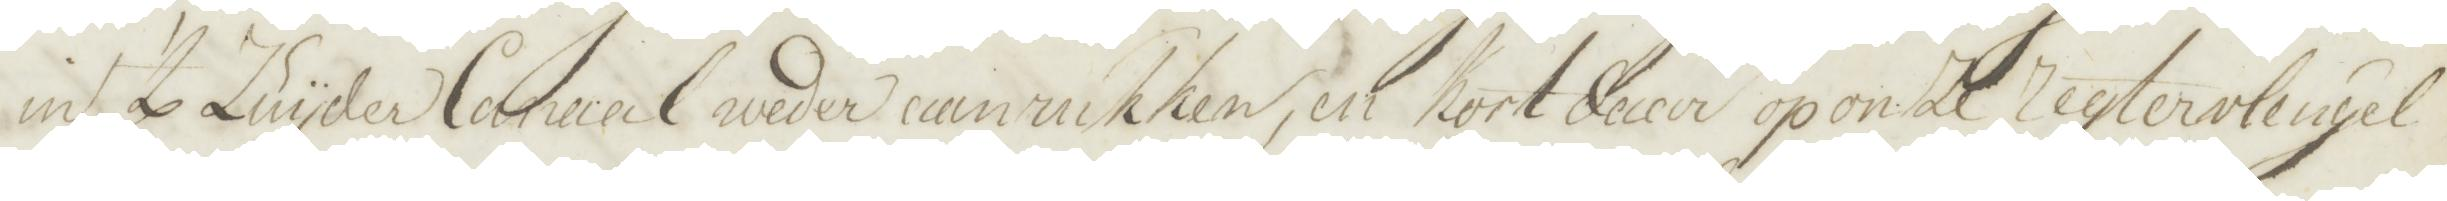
in 't zuijder Canaal weder aanrukken, en kort daar op onze regtervleugel
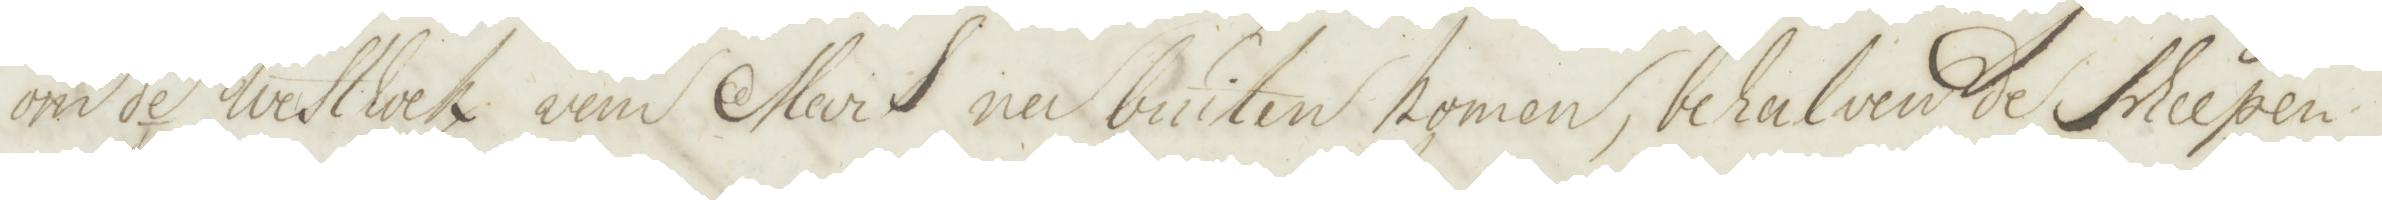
om de westhoek van Mars na buiten komen, behalven de scheepen
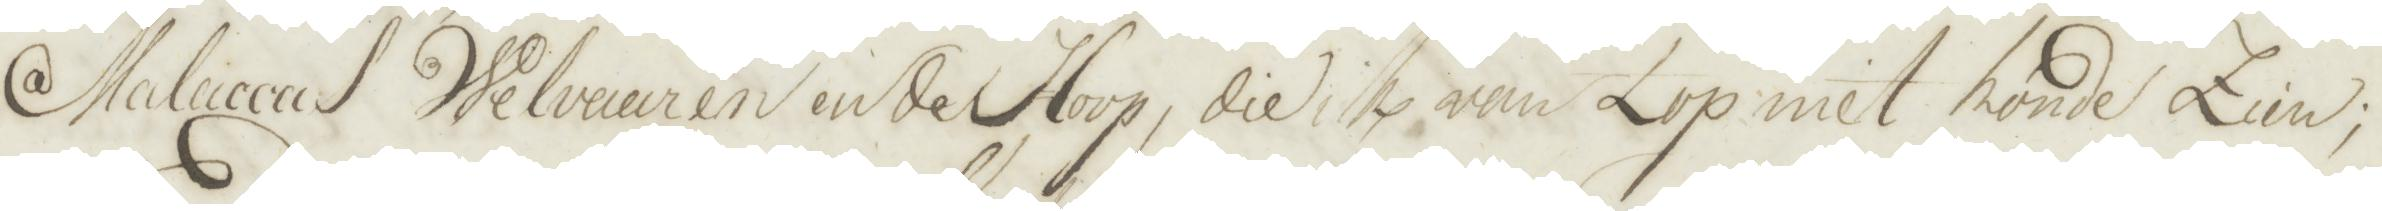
Malaccas Welvaaren en de Hoop, die ik van top niet konde zien;
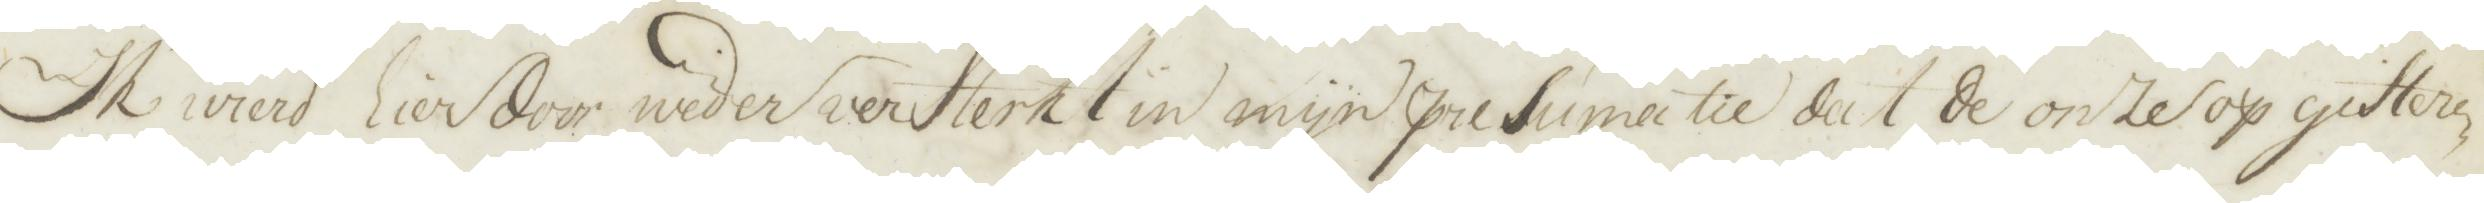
Ik wierd hier door weder versterkt in mijn presumatie dat de onze op gisteren
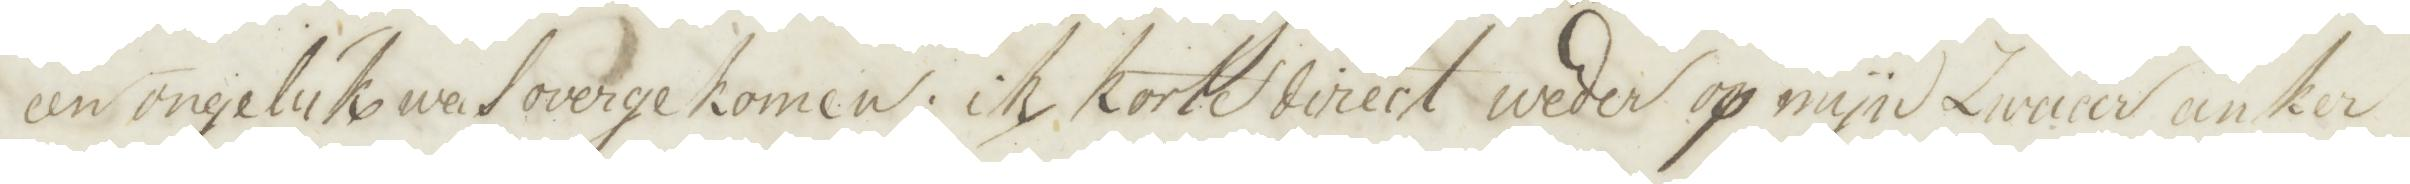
een ongeluk was overgekomen; ik korte direct weder op mijn zwaar anker
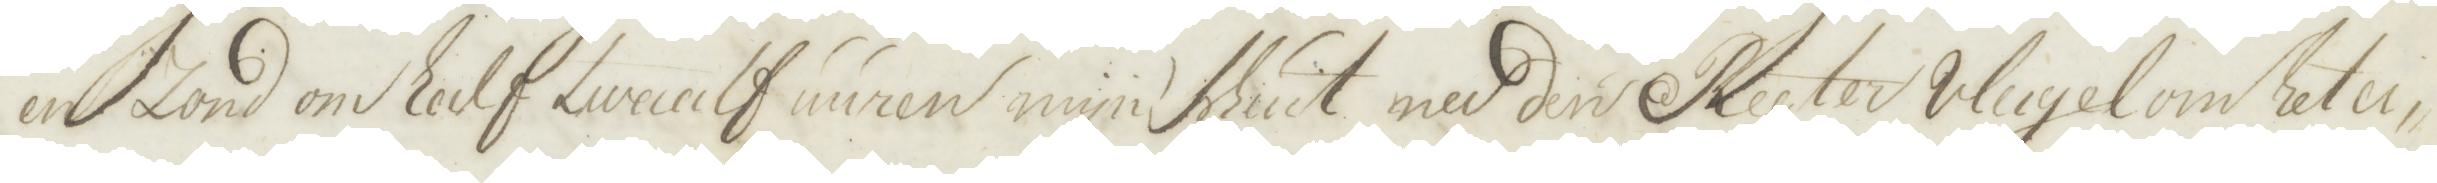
en zond om half twaalf uuren mijn schuit na den Regter Vleigel om het ei„
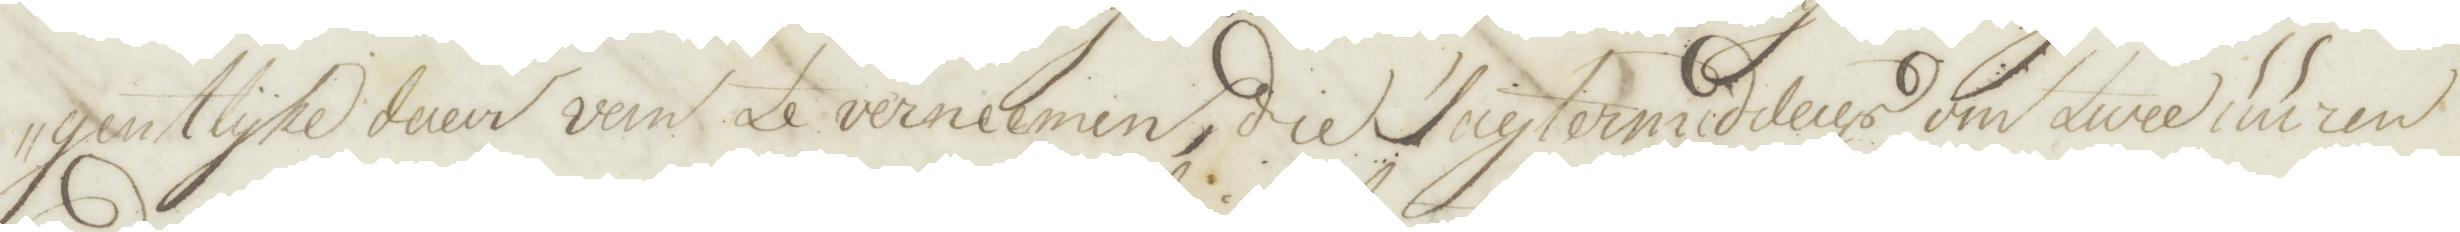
„gentlijke daar van te verneemen, die 'sagtermiddags om twee uuren
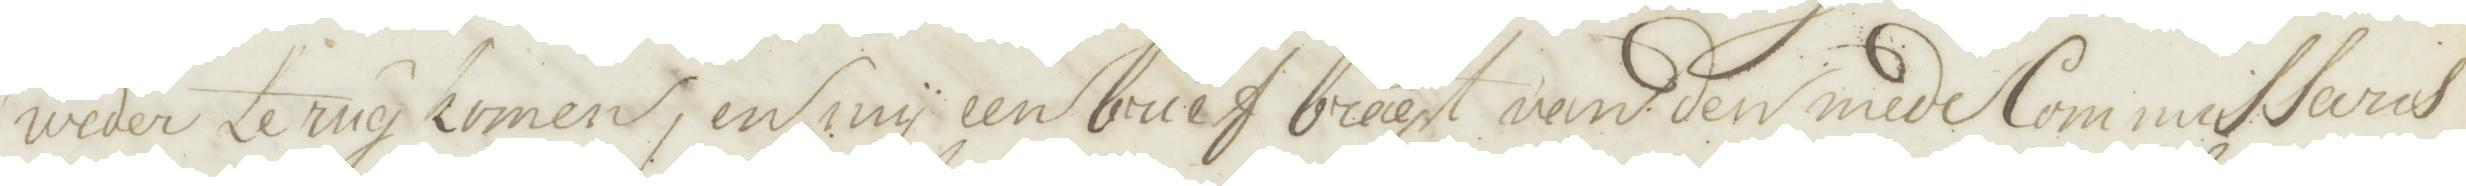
weder terug komen, en mij een brief brengt van den mede Commissaris
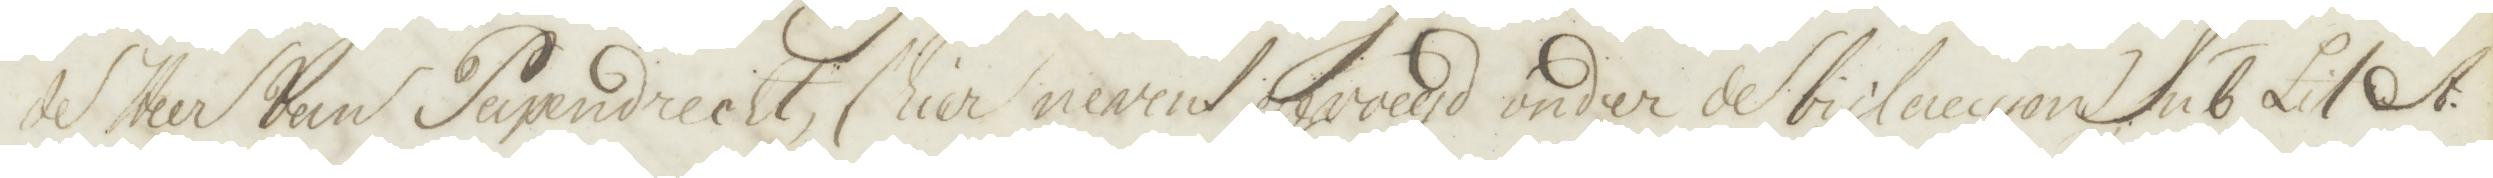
de Heer van Papendrecht, (hier nevens gevoegd onder de bijlaagen) sub Lit A.
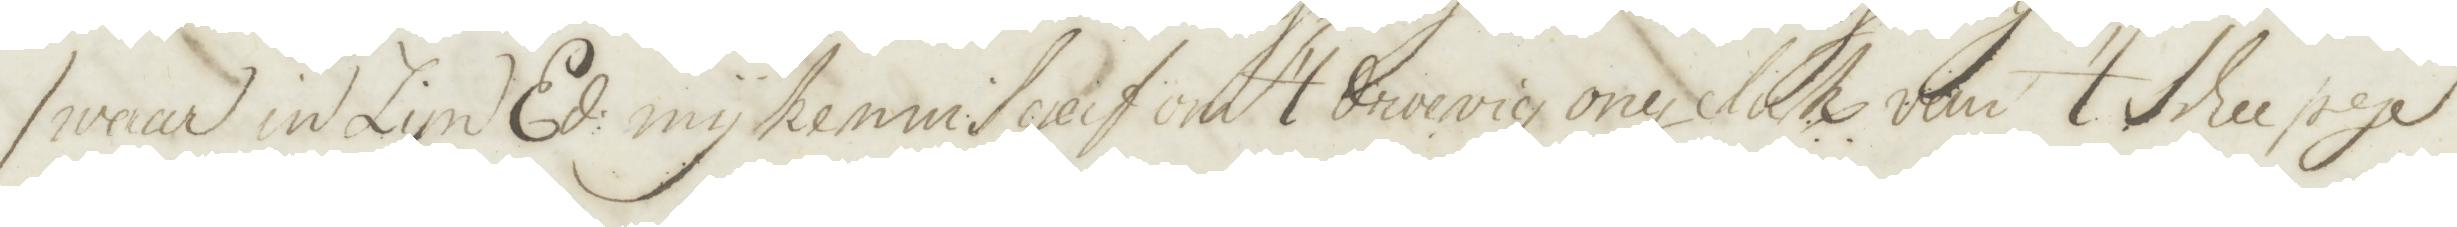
/waar in zijn Ed: mij kennis gaf om 't droevig ongeluk van 't scheepge
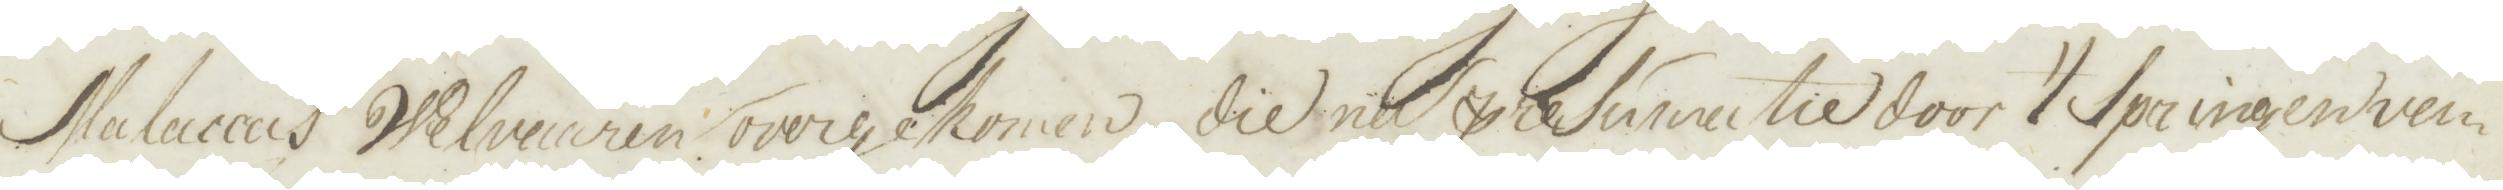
Malaccas Welvaaren overgekomen, die na presumatie door 't springen van
